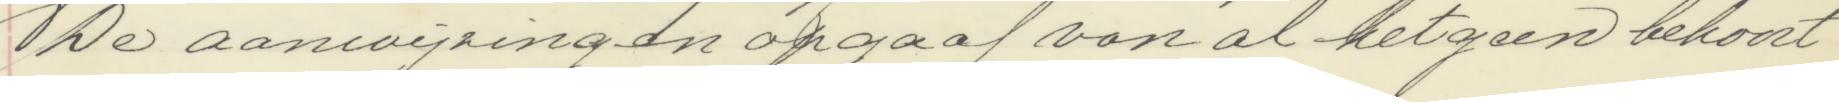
De aanwijzing en opgaaf van al het geen behoort
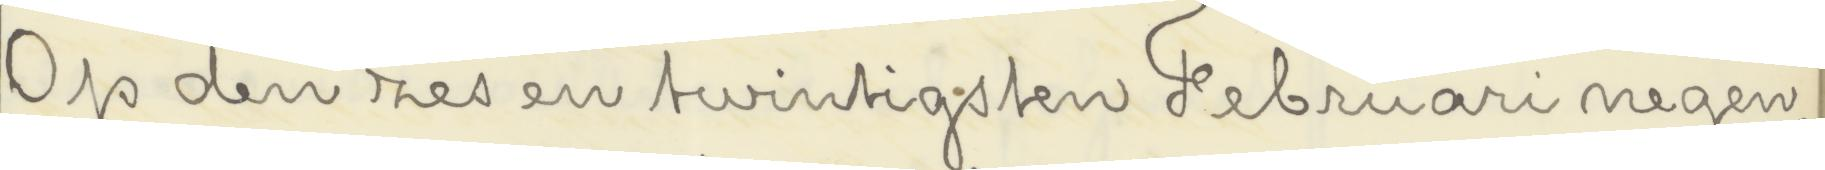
Op den zes en twintigsten Februari negen=
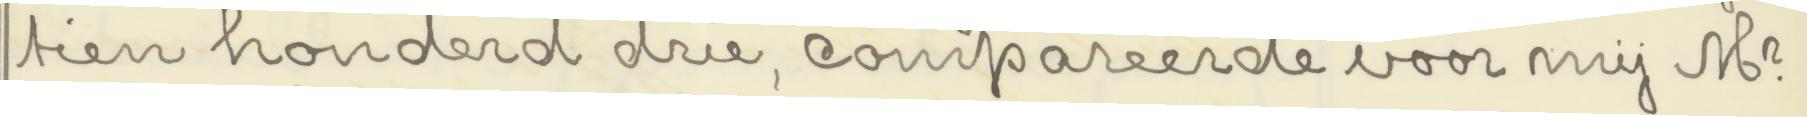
tien honderd drie, compareerde voor mij M.r
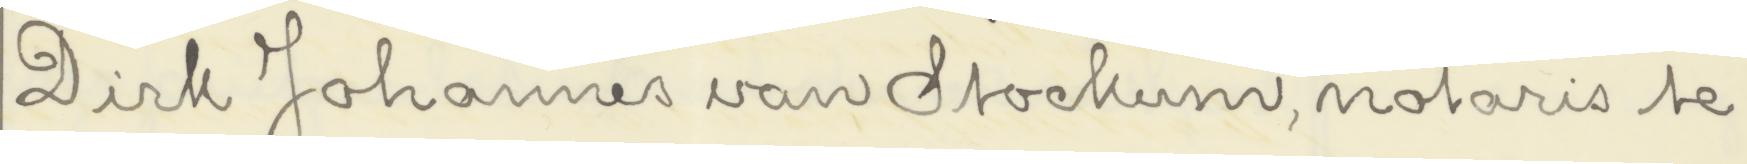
Dirk Johannes van Stockum, notaris te
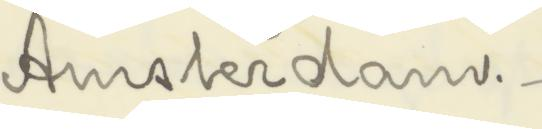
Amsterdam.
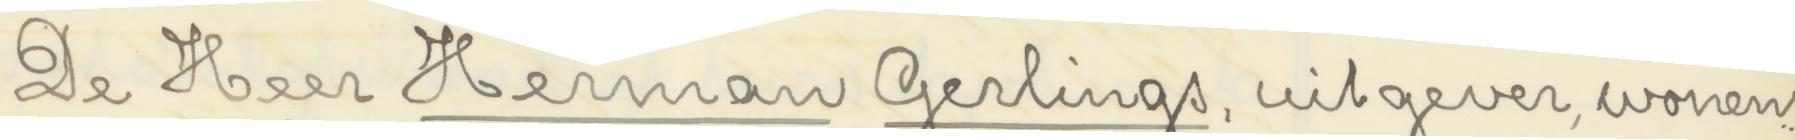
De Heer Herman Gerlings, uitgever, wonen
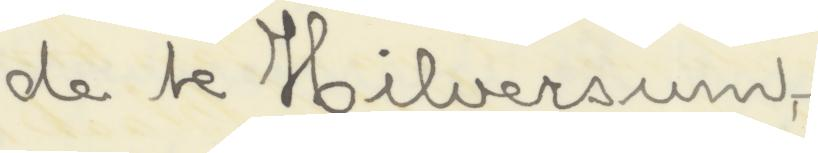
de te Hilversum,
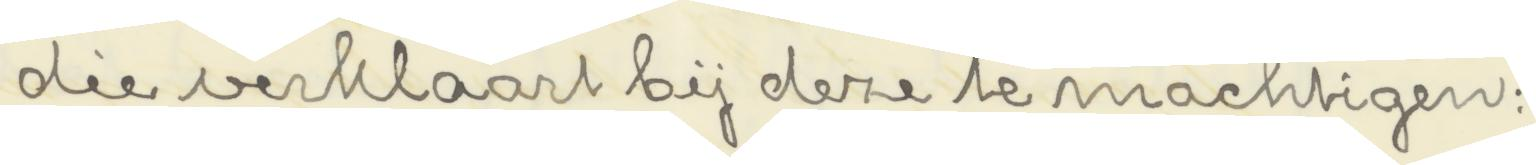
die verklaart bij deze te machtigen:
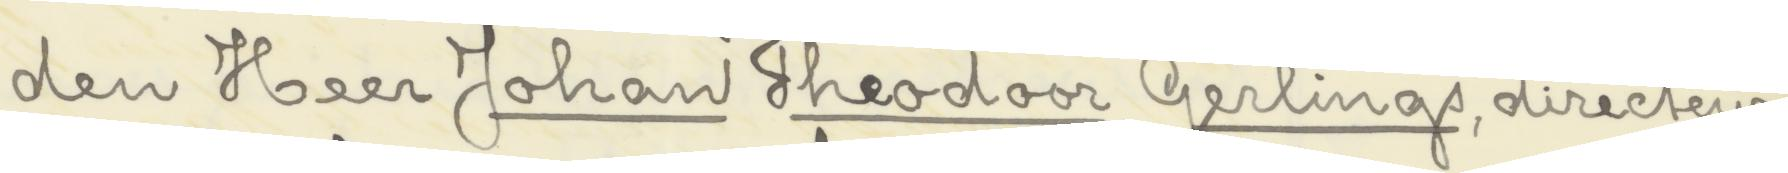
den Heer Johan Theodoor Gerlings, directeur
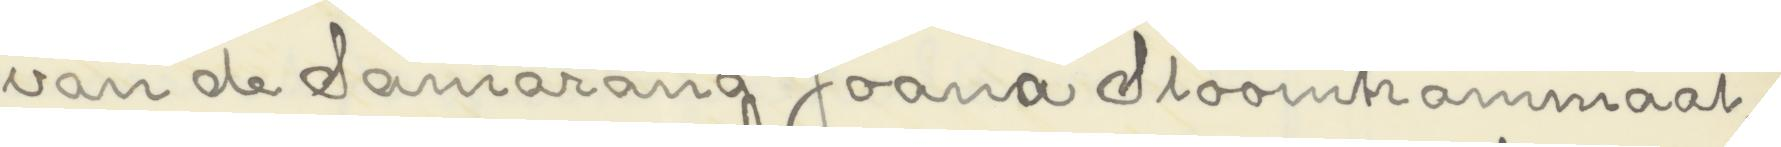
van de Samarang Joana Stoomtrammaat.
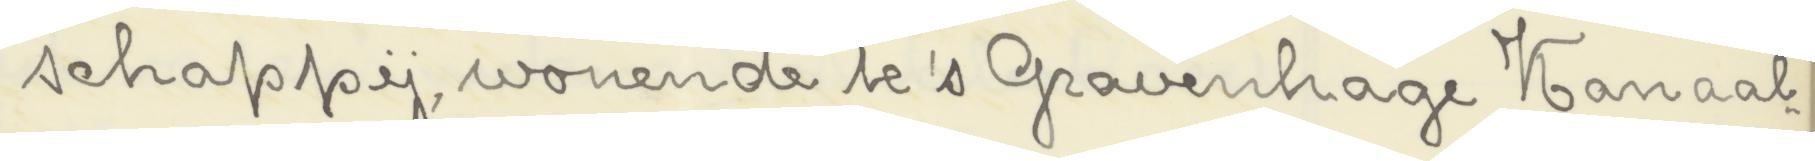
schappij, wonende te 's Gravenhage Kanaal„
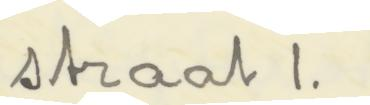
straat 1.
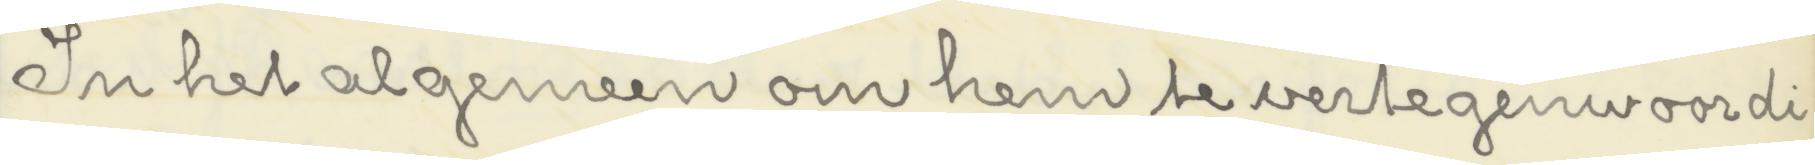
In het algemeen om hem te vertegenwoordi
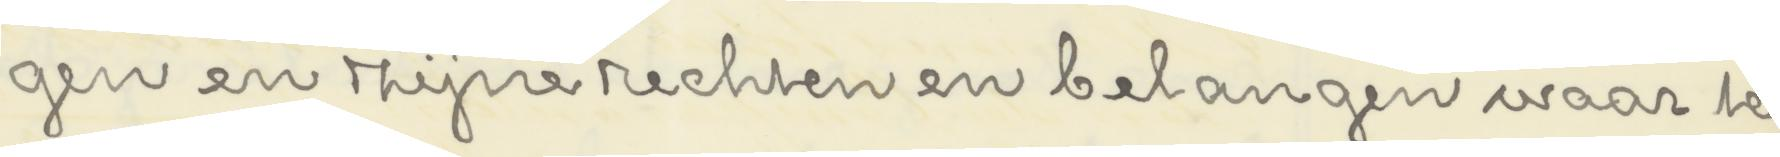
gen en zijne rechten en belangen waar te
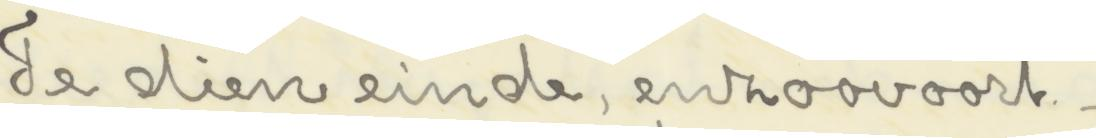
Te dien einde, en zoovoort.
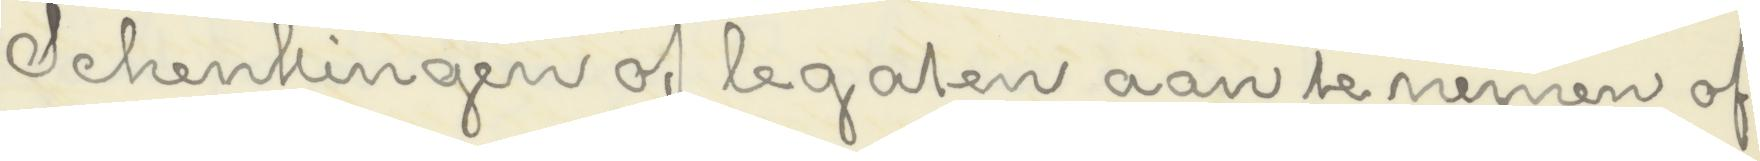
Schenkingen of legaten aan te nemen of
